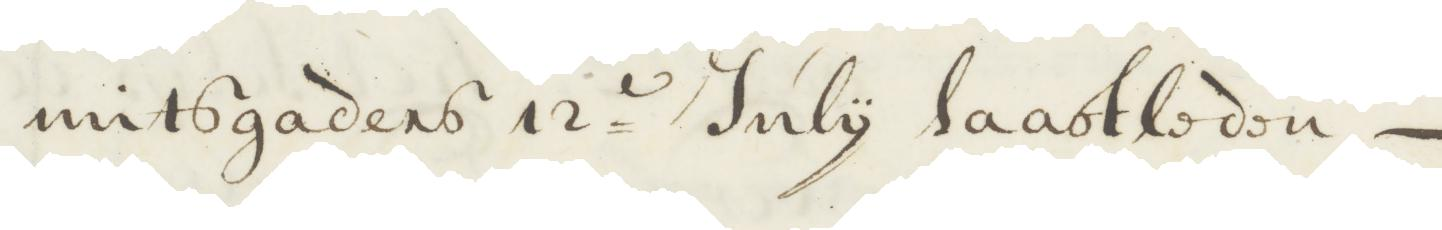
mitsgaders 12=e Julij laastleden -
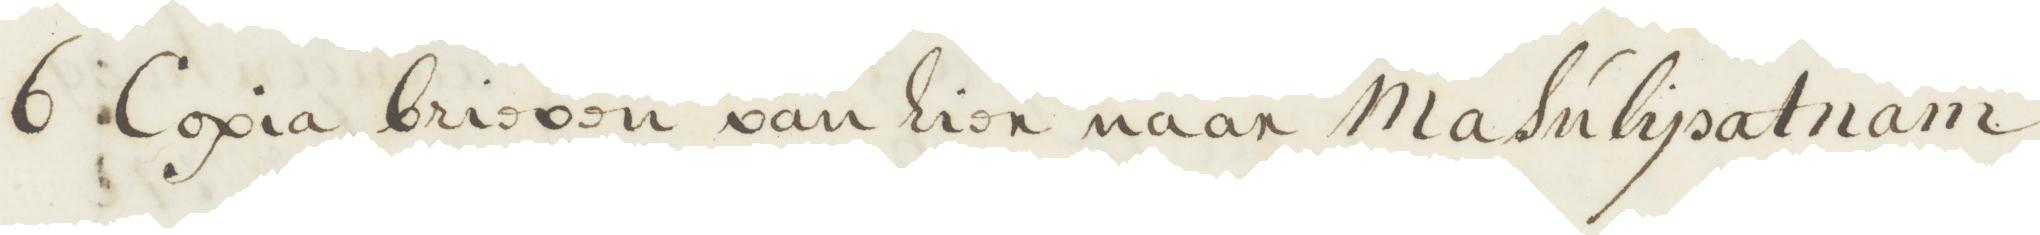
6 Copia brieven van hier naar Masulipatnam
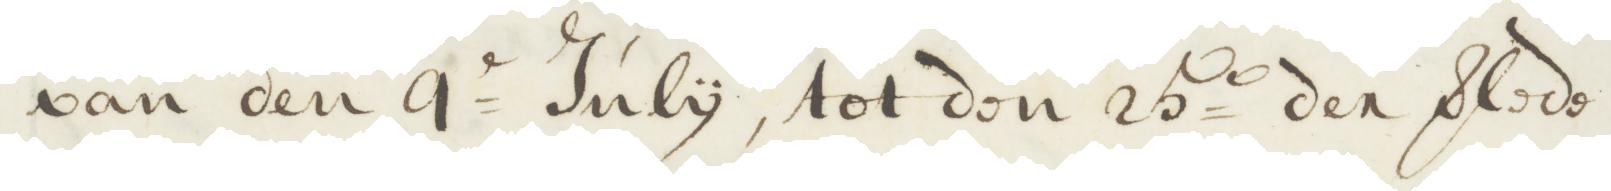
van den 4=e Julij, tot den 25=e der verlede
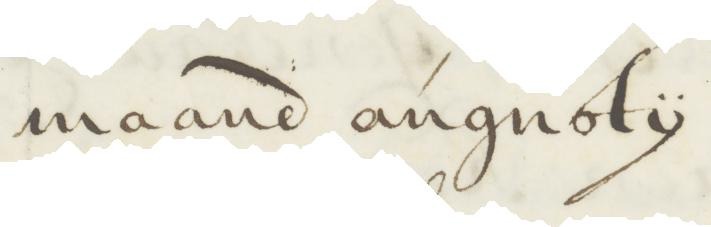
maand augustij
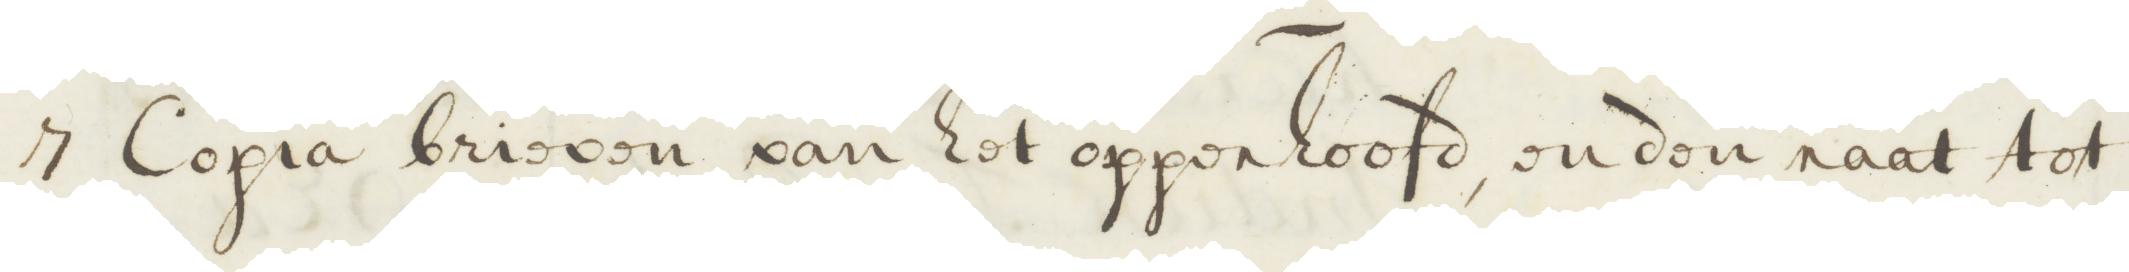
7 Copia brieven van het opperhoofd, en den raat tot
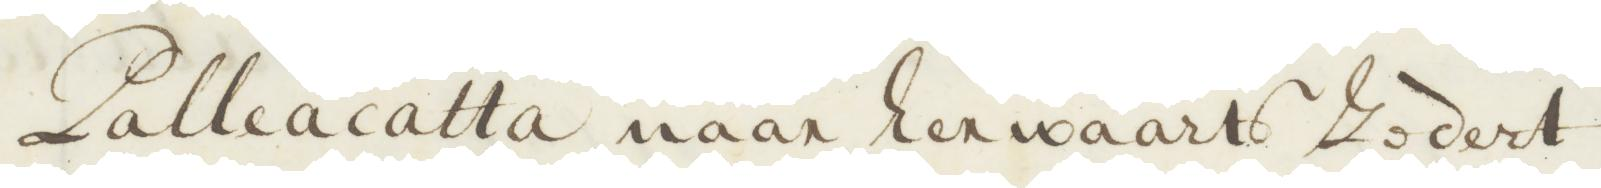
Palleacatta naar herwaarts Zedert
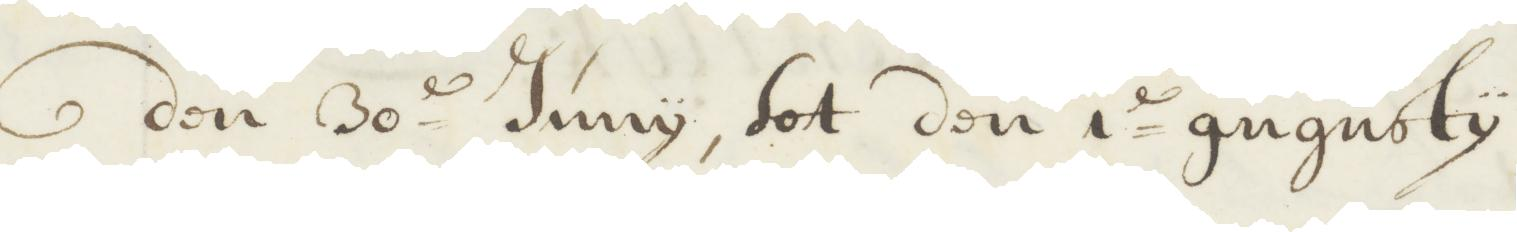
den 30=e Junij, tot den 1=e gugustij
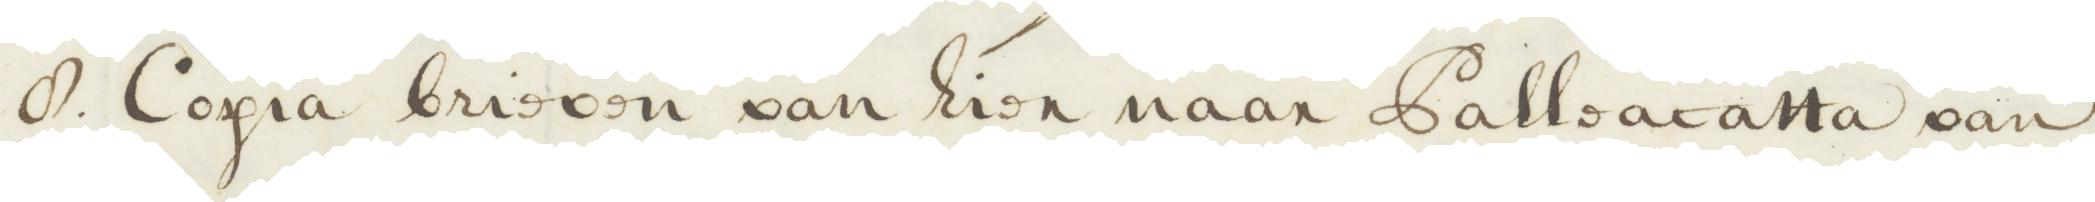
8. Copia brieven van hier naar Palleacatta van
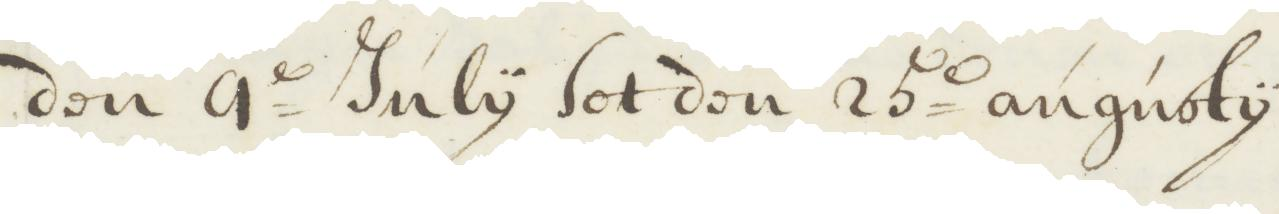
den 4=e Julij tot den 25:e augustij
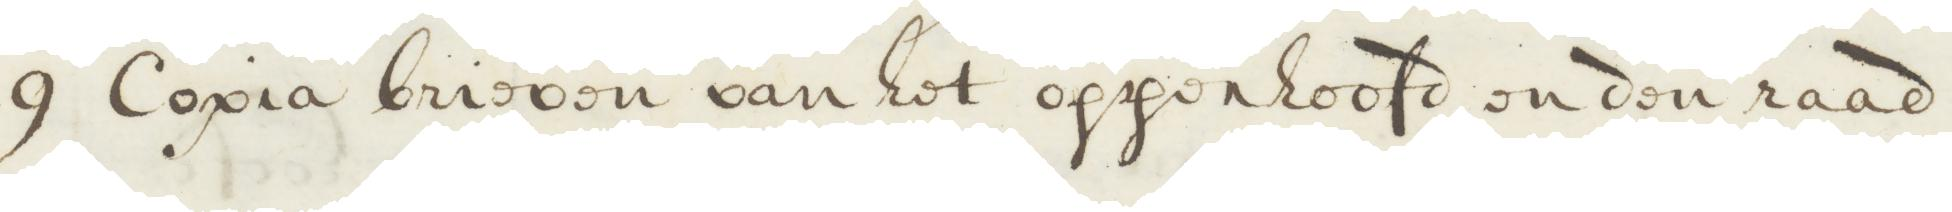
9 Copia brieven van het opperhoofd en den raad
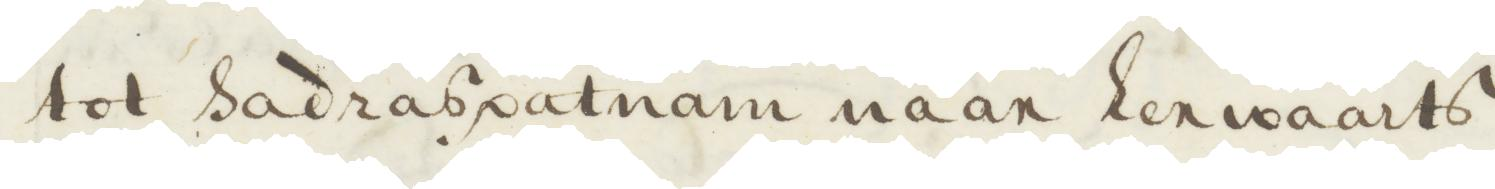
tot sadraspatnam naar herwaarts
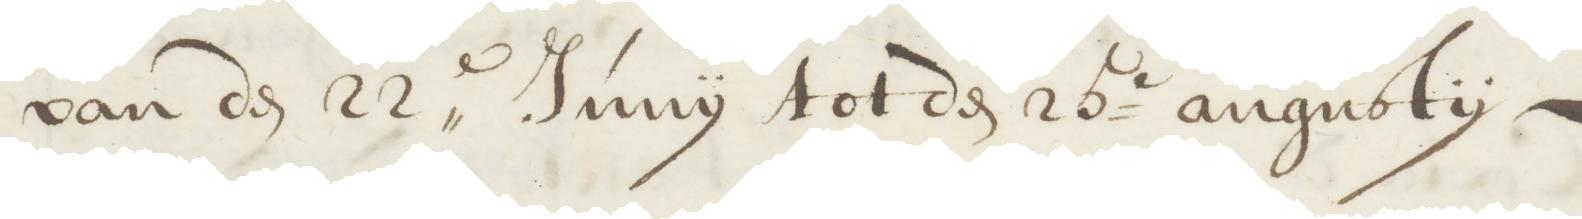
van den 22„e Iunij tot den 25=e augustij
